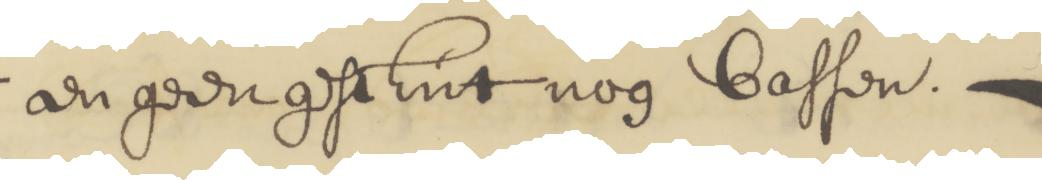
en geen geschut nog bassen. —
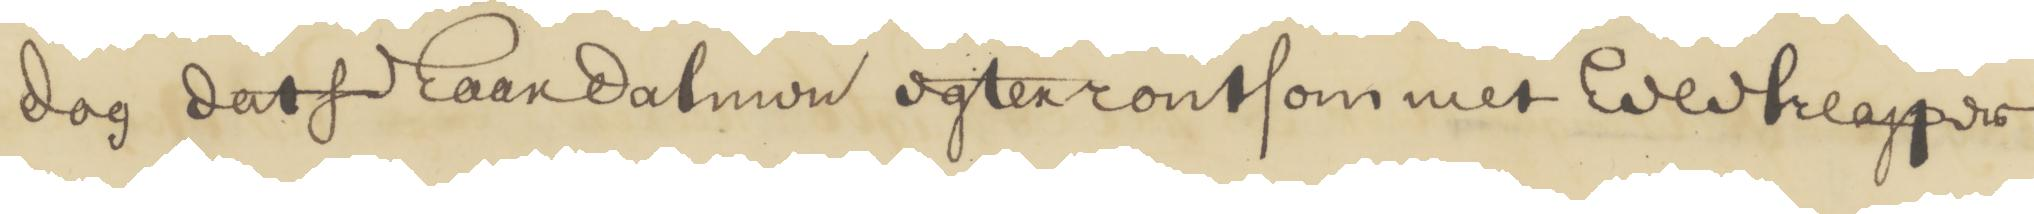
dog datse haar dalmen egter rontsom met heleklapper
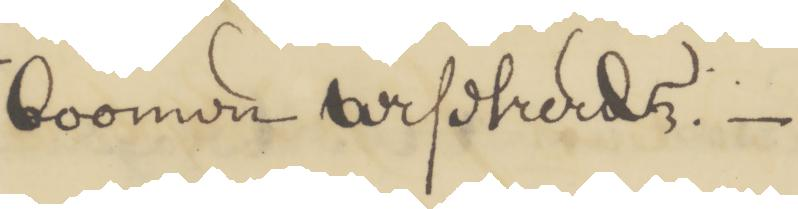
boomen versekerden. —
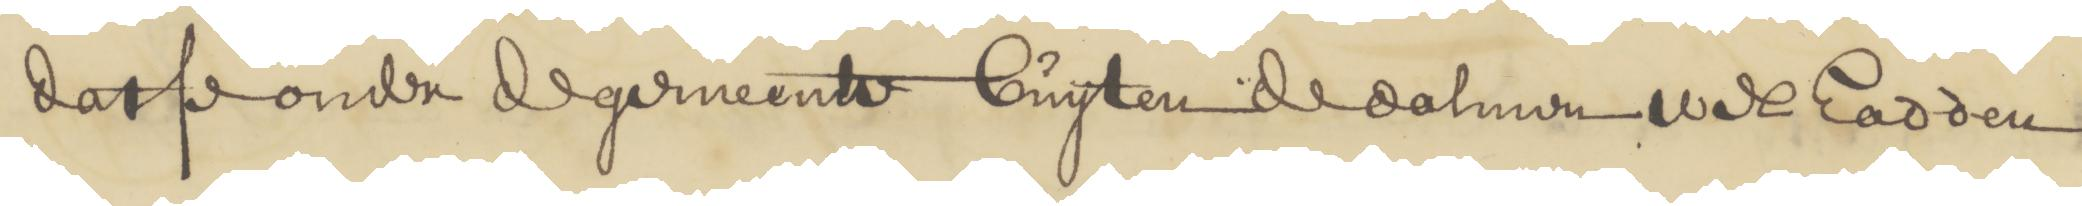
datse onder de gemeente buijten de dalmen wel hadden
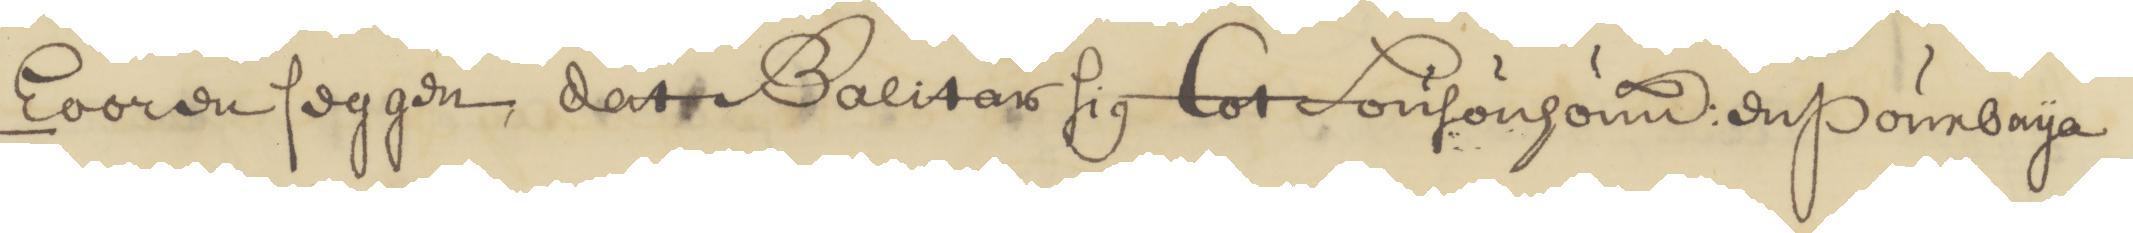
hooren seggen, dat Balitar sig tot Sousouhoun: en Pourbaija
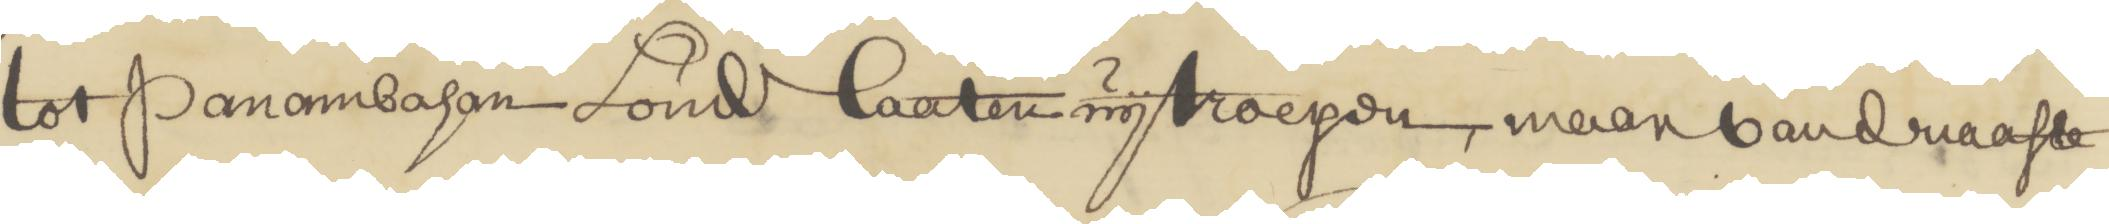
tot Panambahan soude laaten uijtroepen, maar van de naaste
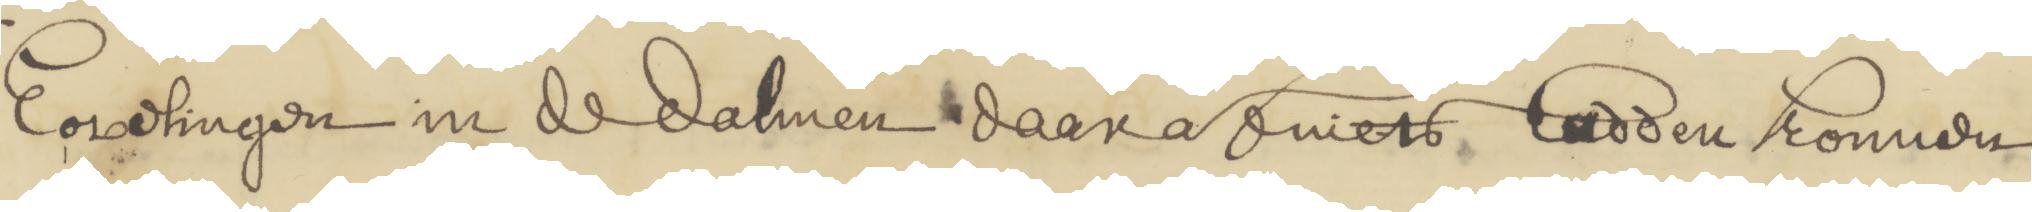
hovelingen in de dalmen daar afniets hadden konnen
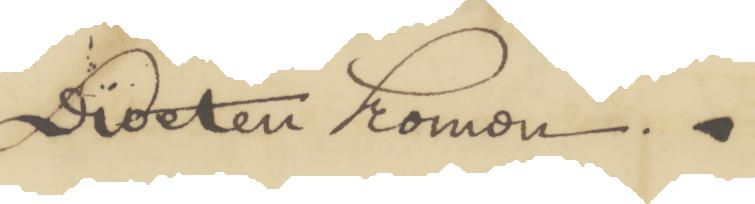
teweten komen. -
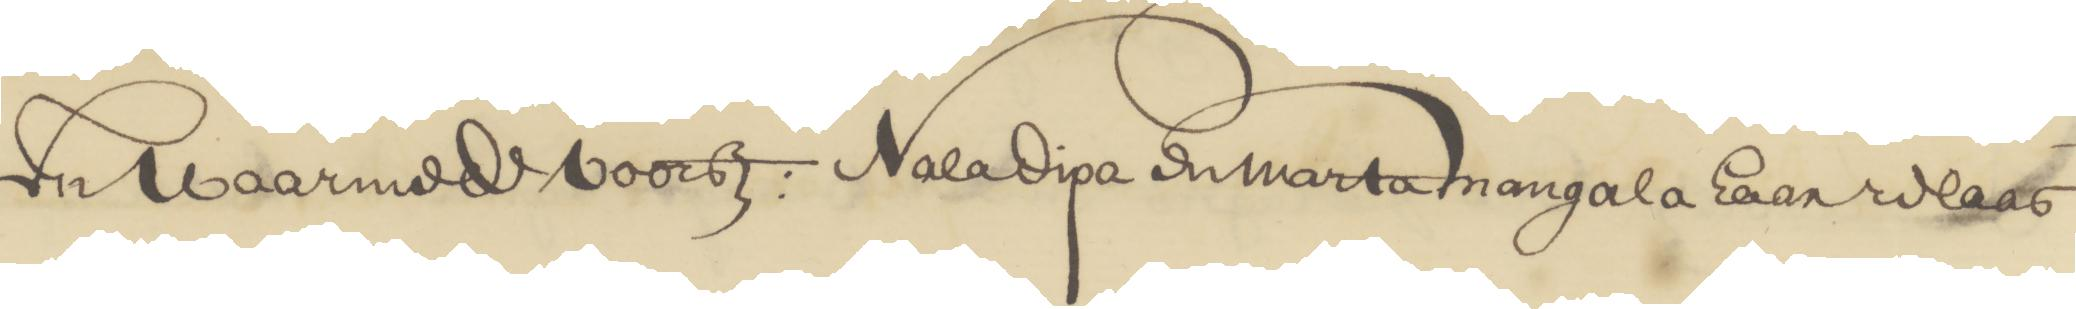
En waarmede voorsz: Naladipa en marta mangala haar relaas
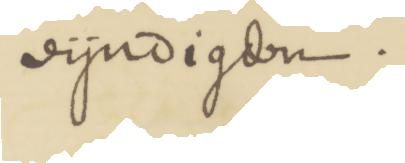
eijndigden.
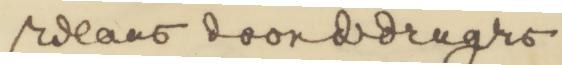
relaas door de dragers
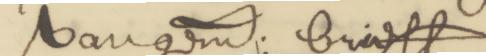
van gem: brieff
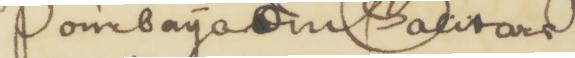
Pourbaija om Balitars
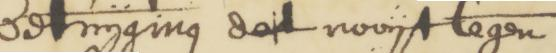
betuijging dat nooijt tegen
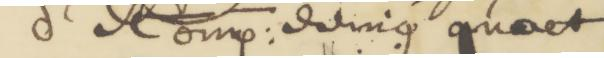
d’ Ecomp: eenig quaet
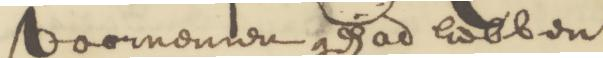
voornemen gehad hebben
